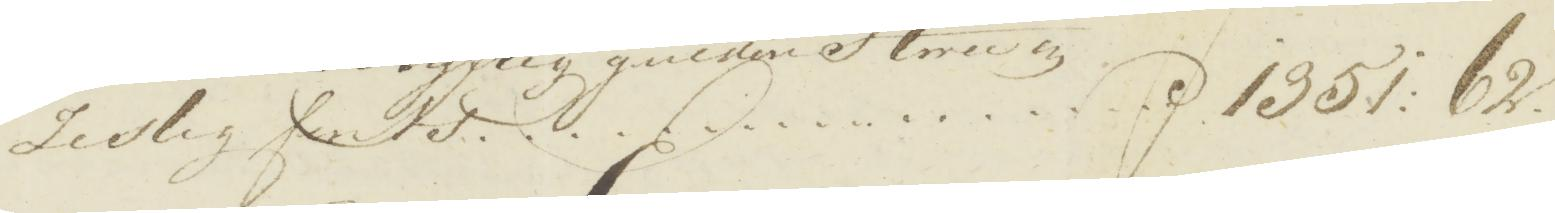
Zestig Cents. . . . . . . . . . . . . . . . . . . . . . ƒ 1351: 62.
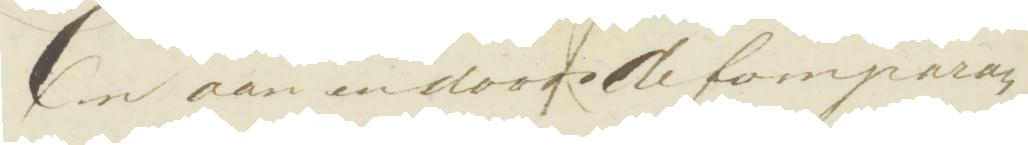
En aan en door de Comparan„
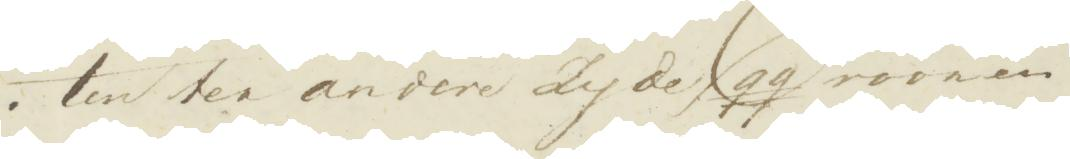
„ten ter andere Zyde qq voor en
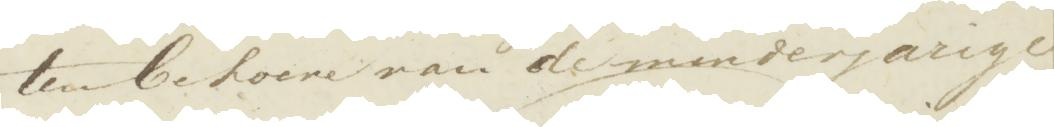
ten behoeve van de minderjarige
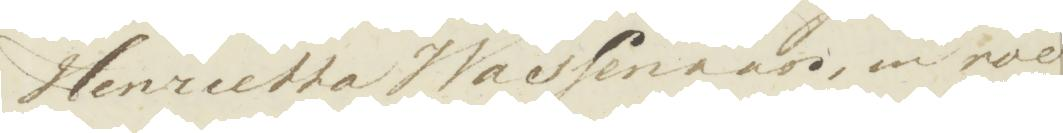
Henrietta Wassenaars, in vol-
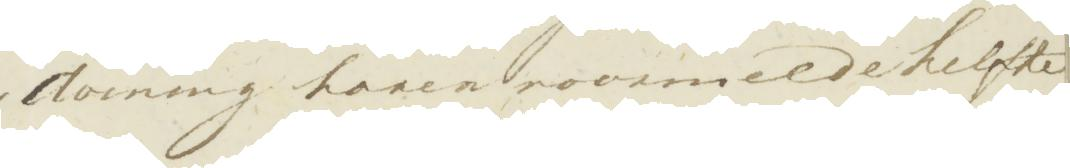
„doening haren voormelde helfte
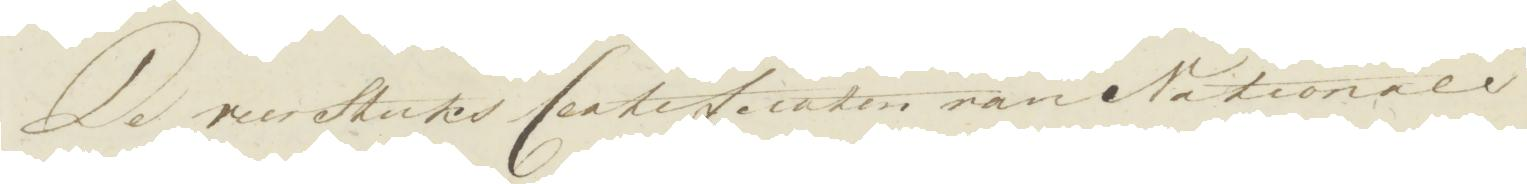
De vier stuks Certificaten van Nationale
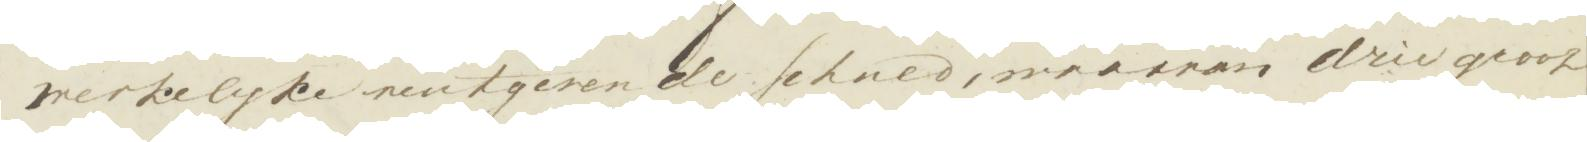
werkelyke rentgevende schuld, waarvan drie groot
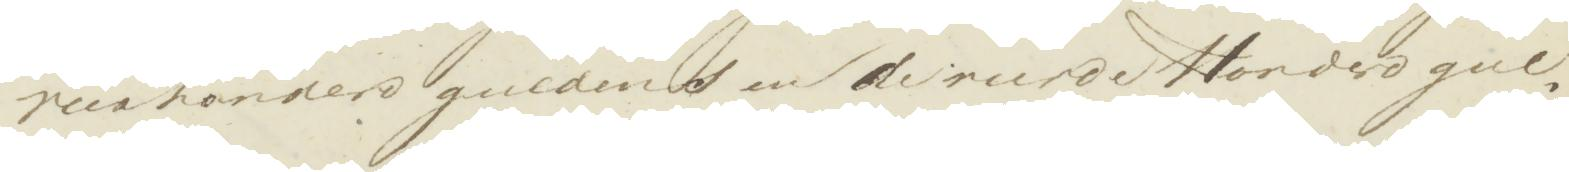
vierhonderd guldens en de vierde Honderd gul„
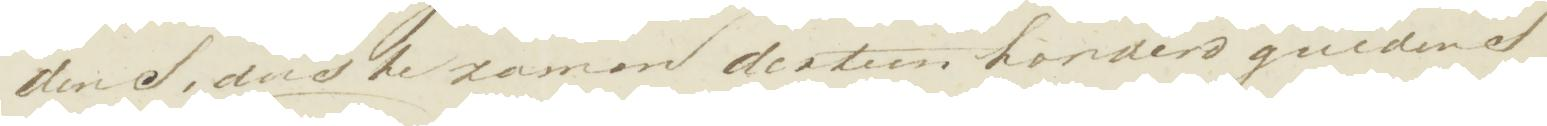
dens, dus te zamen dertien honderd guldens
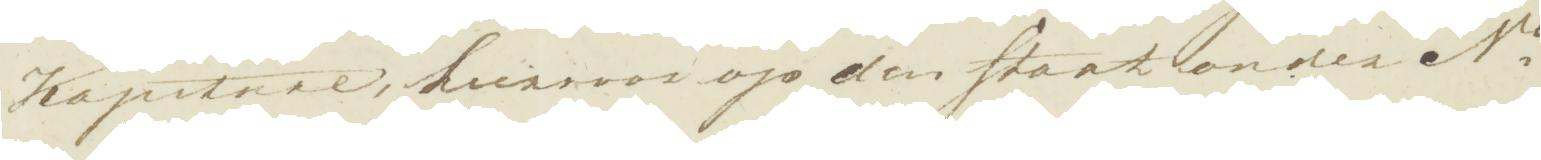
Kapitaal, hiervoor op den Staat onder N.
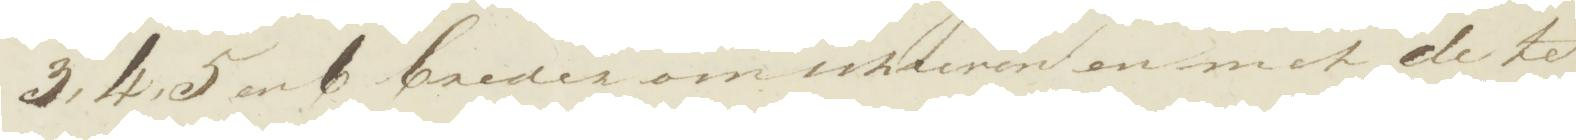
3, 4, 5 en 6 breder omschreven en met de te
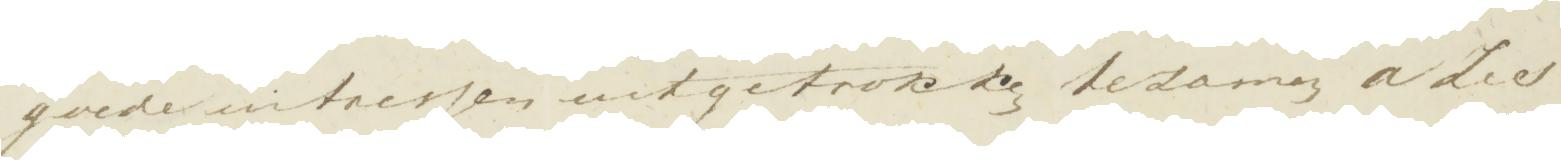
goede intressen uitgetrokken tezamen a Zes
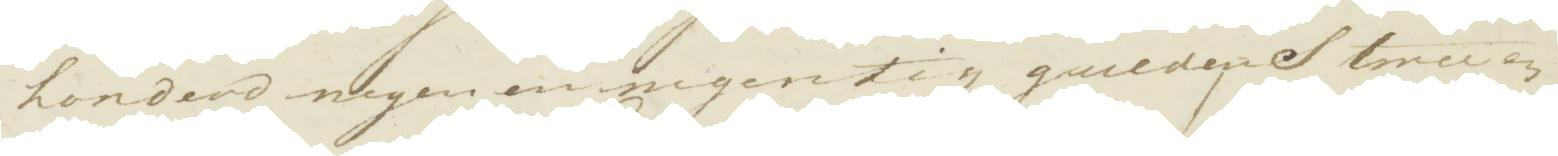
honderd negen en negentig guldens twee en
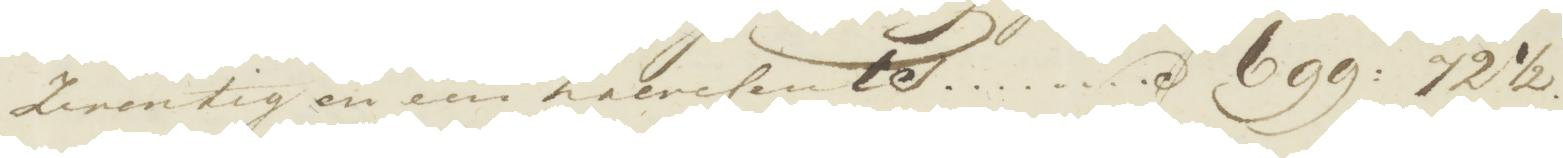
Zeventig en een halve Cents . . . . . . . . ƒ 699: 72½.
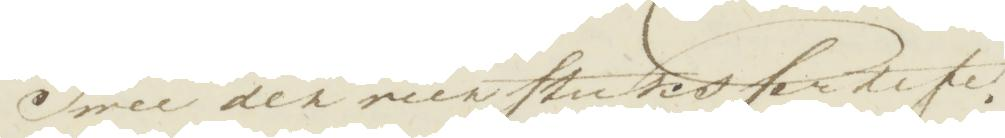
Twee der vier stuks Certifi,
